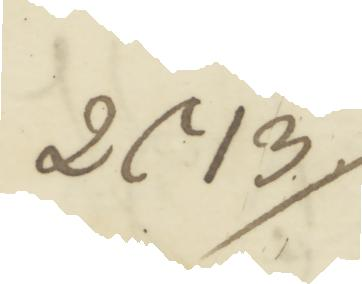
2513.
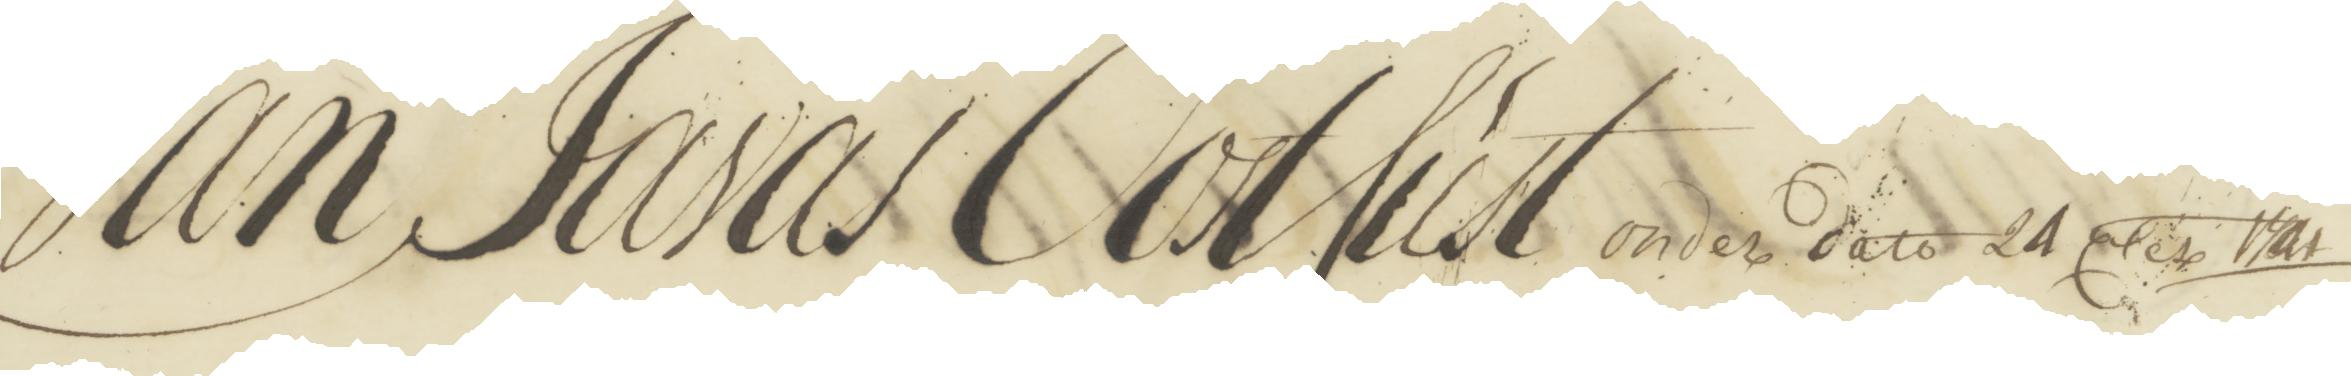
Van Javas Oost Cust onder dato 24 xber 1741
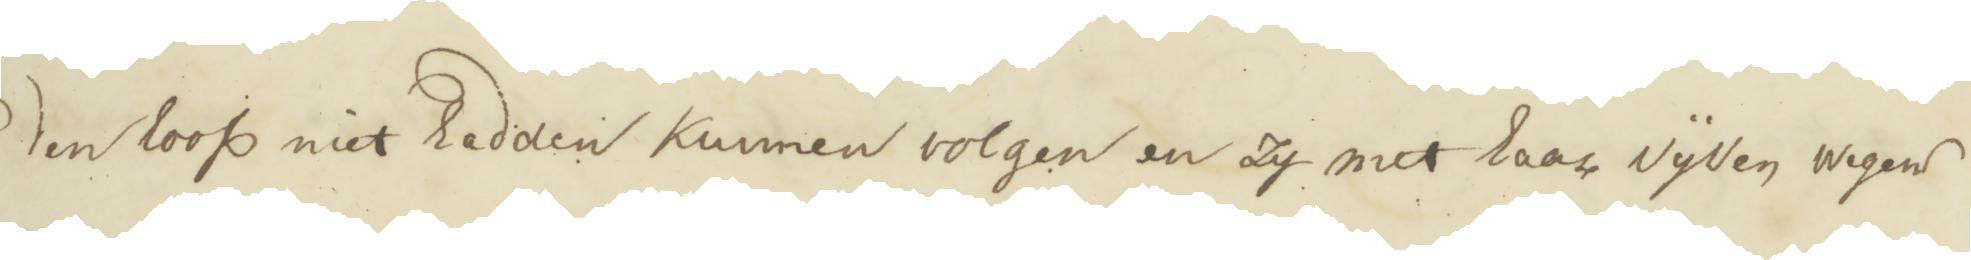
den loop niet hadden kunnen volgen en zy met haar vijven wegens
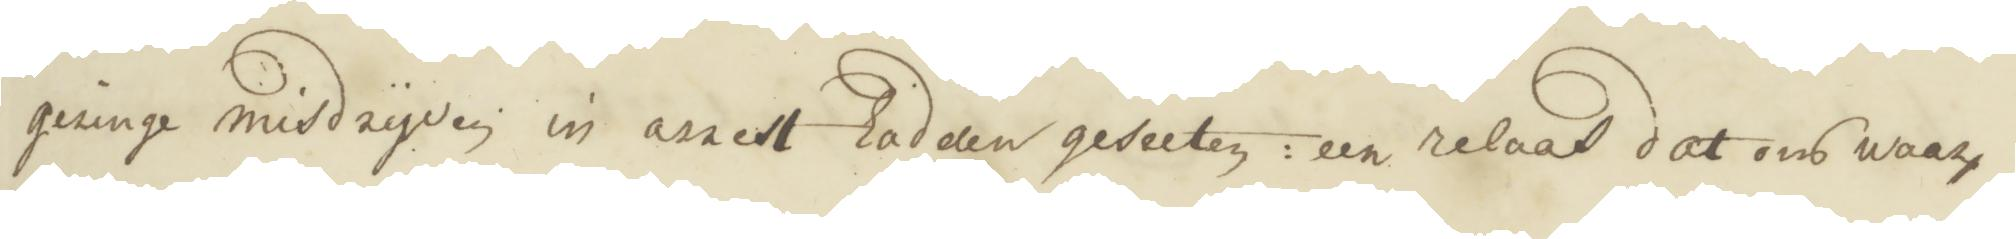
geringe misdrijven in arrest hadden geseeten: een relaas dat ons waar„
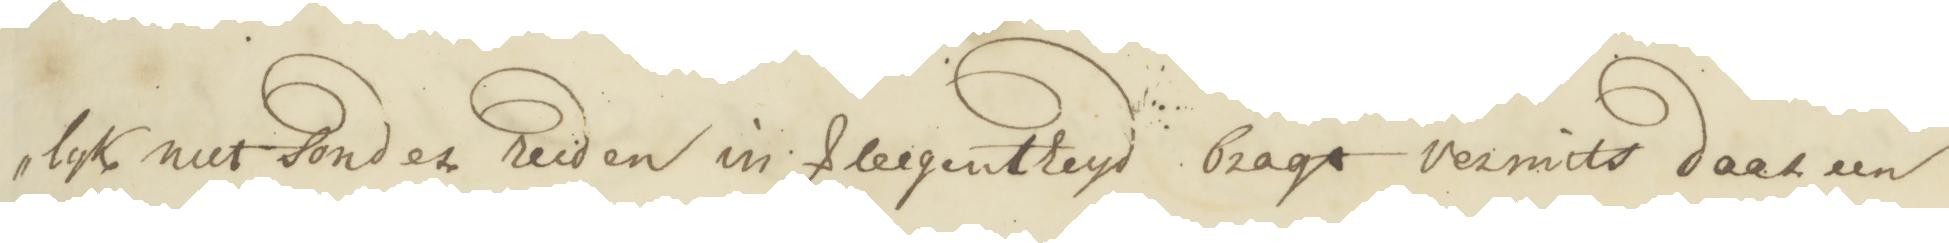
„lyk niet sonder reeden in verleegentheijd bragt vermits daar een
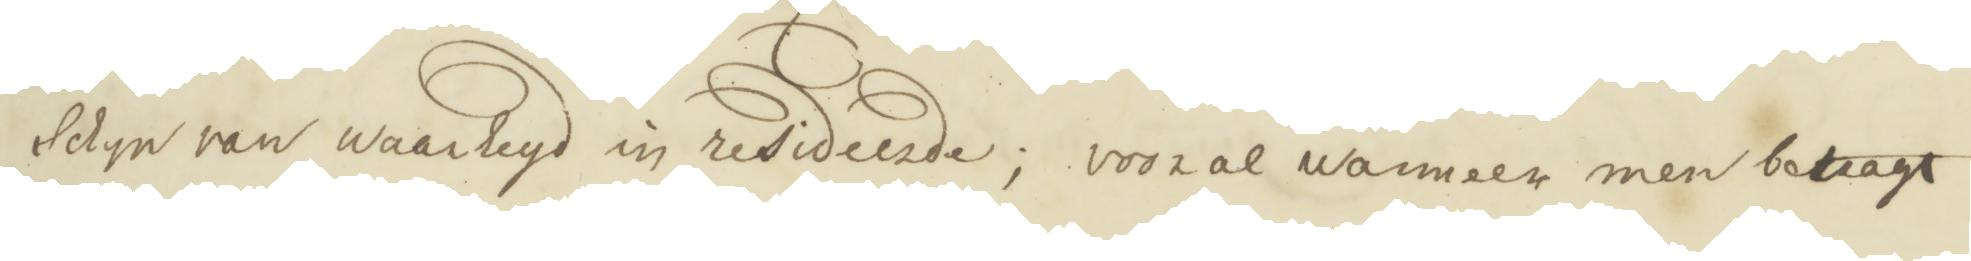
schyn van waarheyd in resideerde; voor al wanneer men betragt
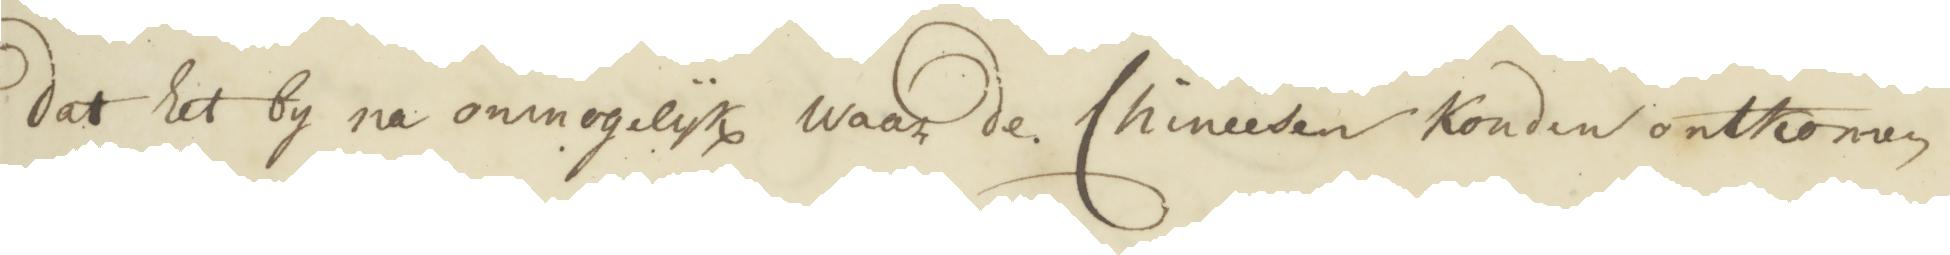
dat het by na onmogelijk waar de Chineesen konden ontkomen
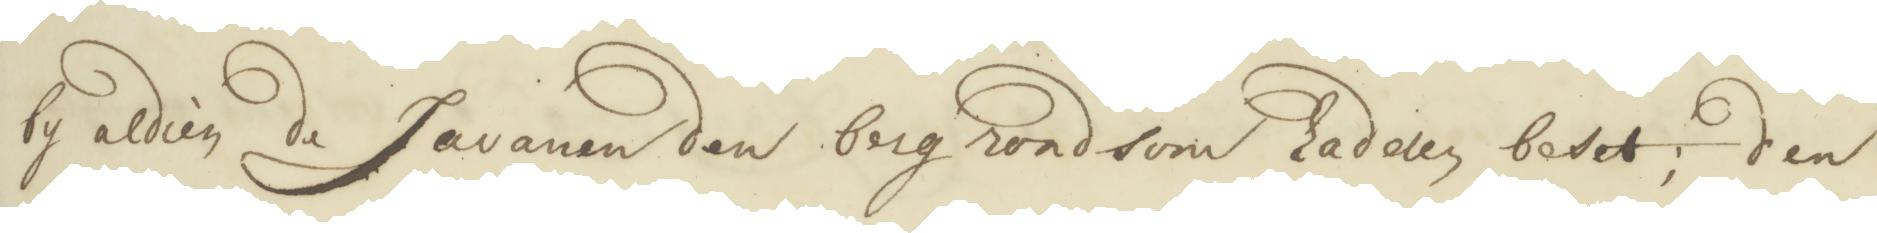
by aldien de Javanen den berg rondsom hadden beset; den
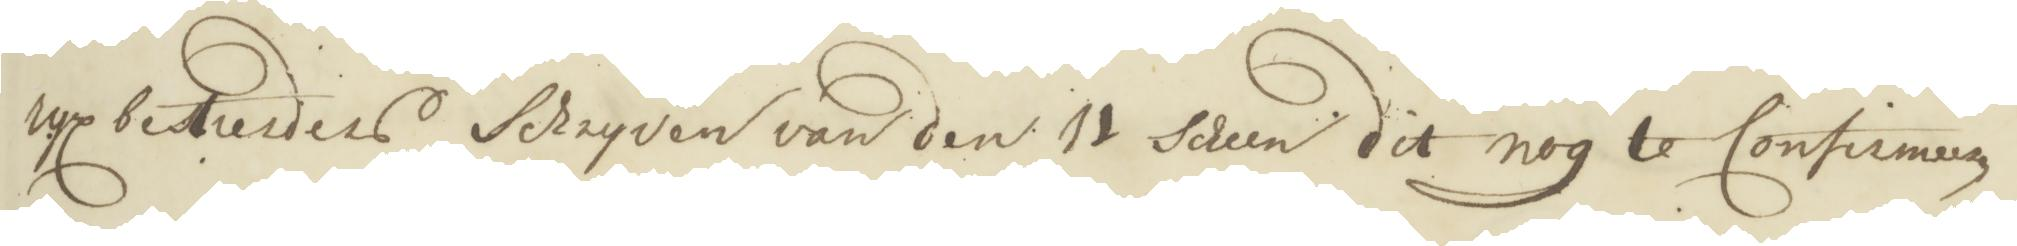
ryx bestierders schryven van den 11 scheen dit nog te Confirmeeren
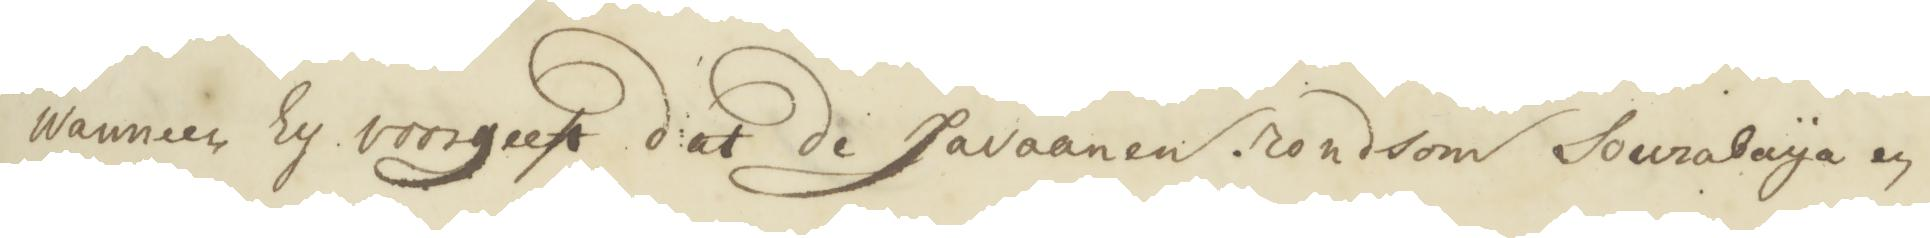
wanneer hy voorgeeft dat de Javaanen rondsom sourabaija en
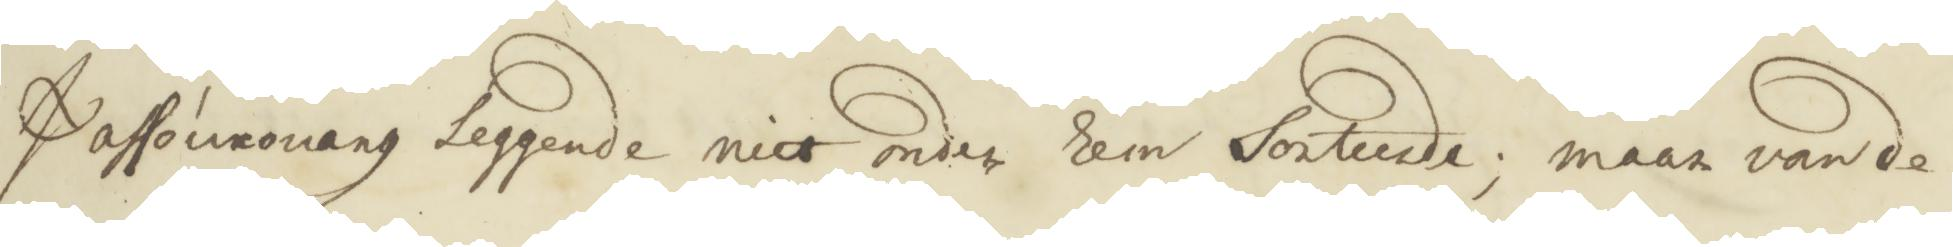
Passourouang leggende niet onder hem sorteerde; maar van de
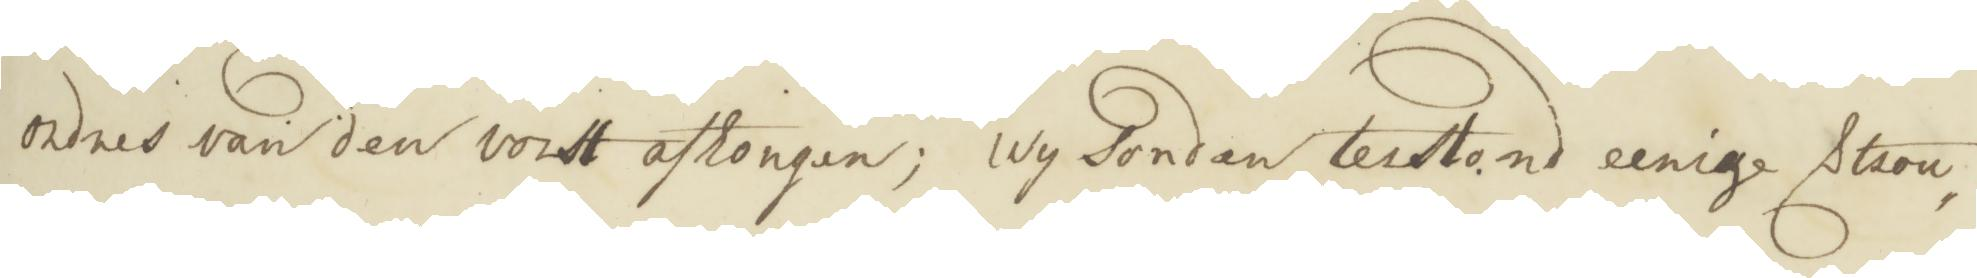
ordres van den vorst afhongen; wij sonden terstond eenige vertrou„
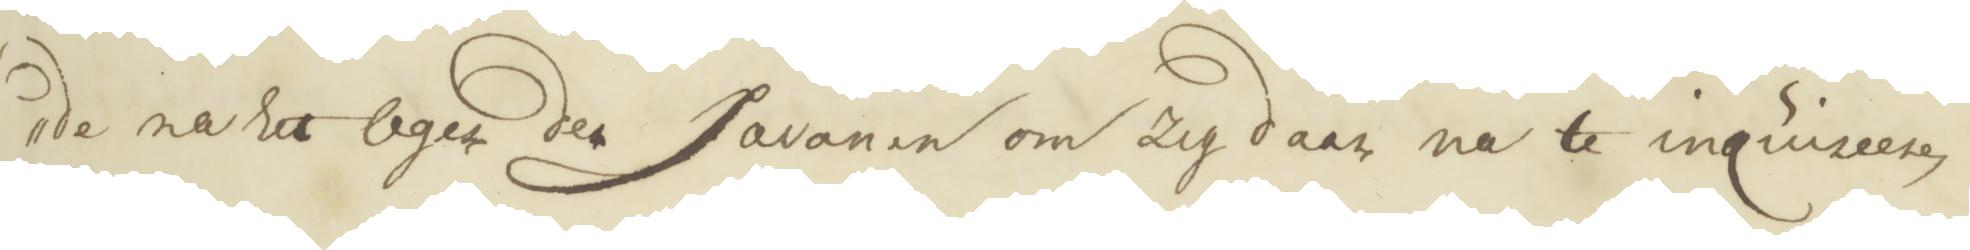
„de na het leger der Javanen om zig daar na te inquireeren
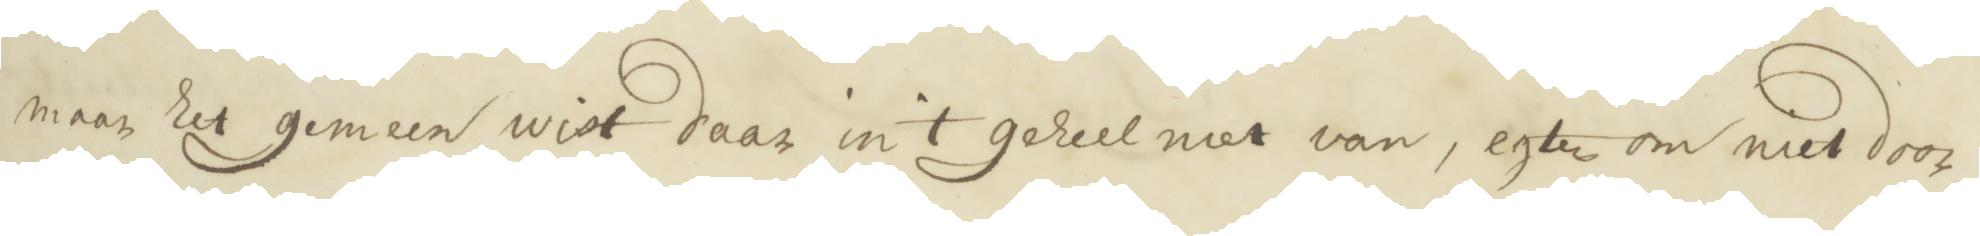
maar het gemeen wist daar in’t geheel niet van, egter om niet door
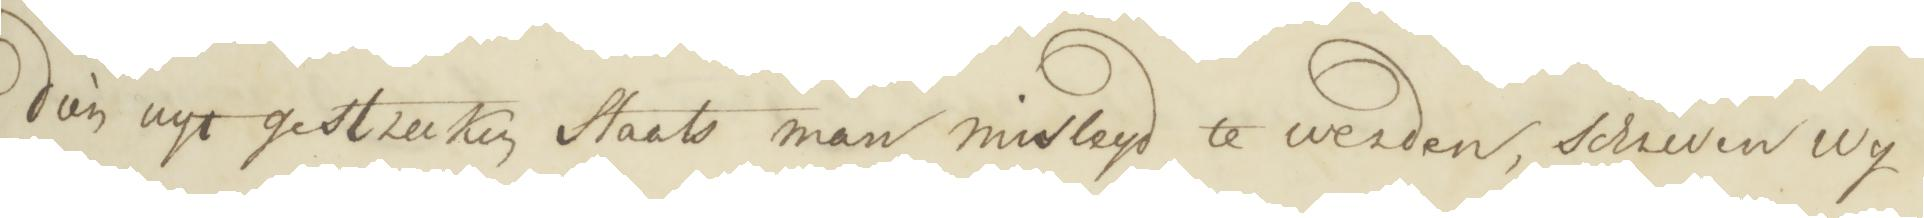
dien uyt gestreeken staats man misleyd te werden, schreven wy
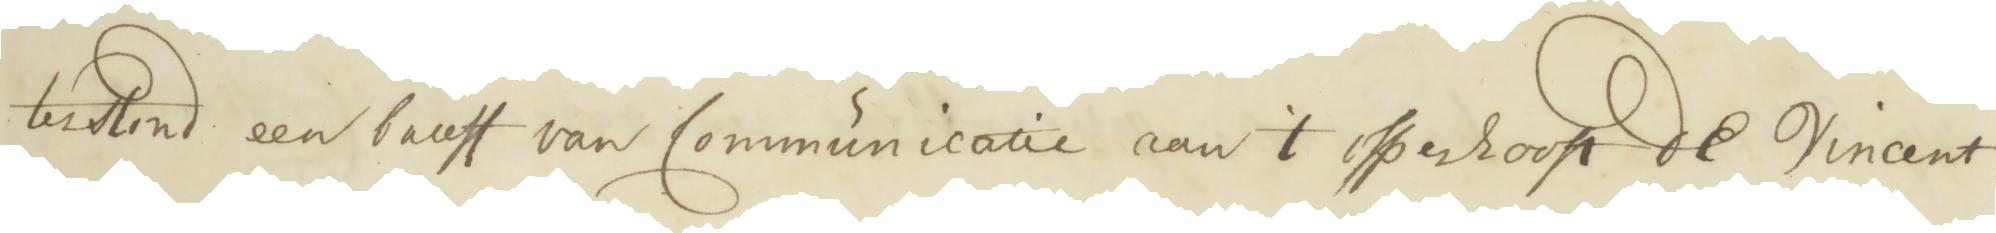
terstond een brieff van Communicatie aan ’t opperhooft dE Vincent
